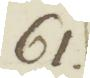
61.
